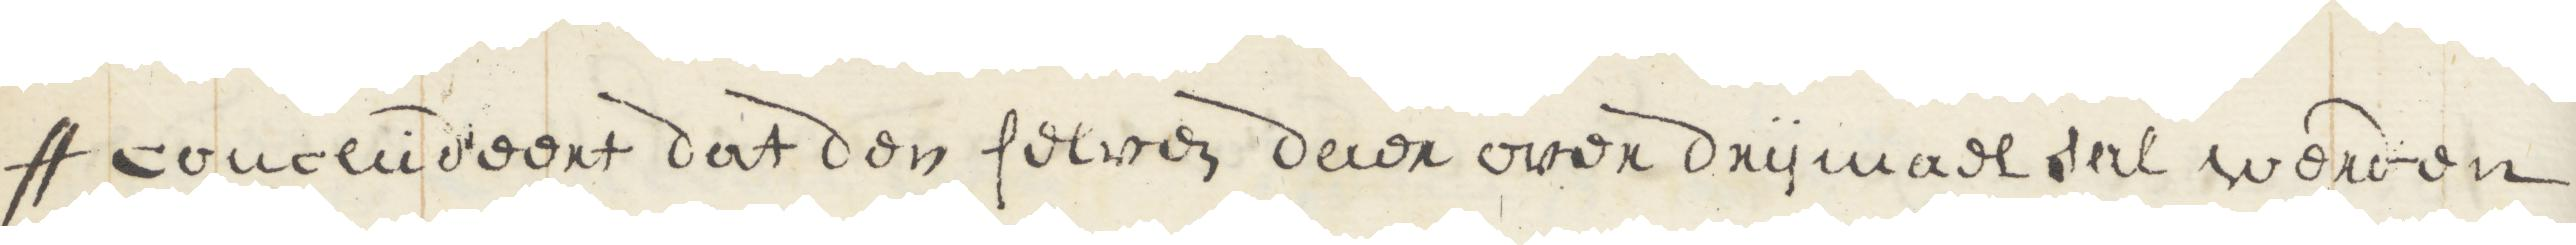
# concludeert dat den selven daer over drijmael sal werden
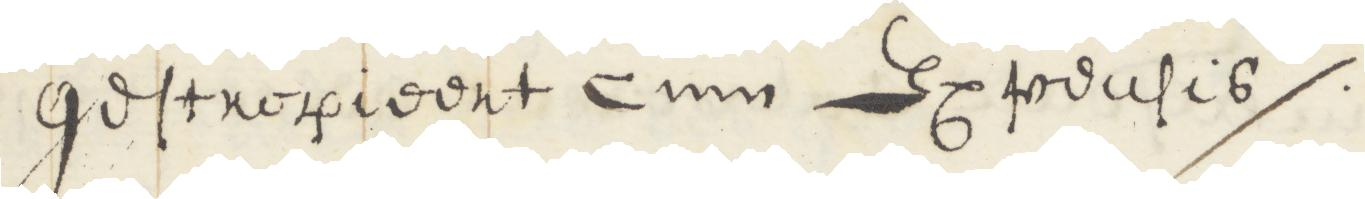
gestropieert cum Expensis /.
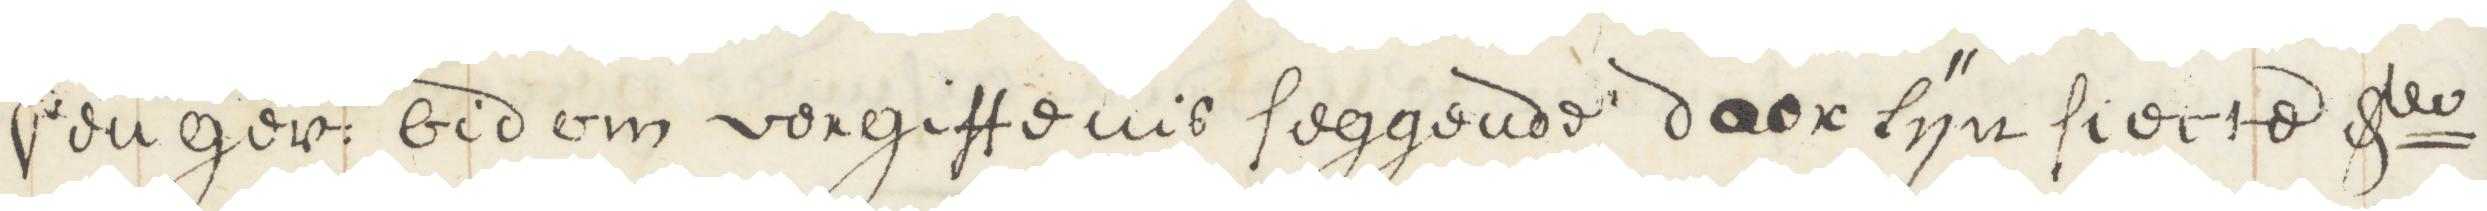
den gev:n bid om vergiffenis seggende door sijn siecte ver=te
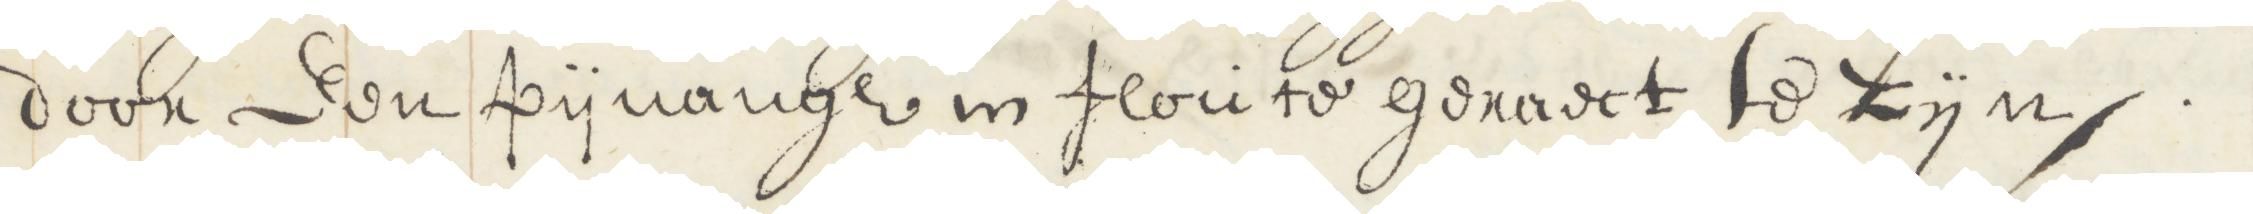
door Een pijnangh in floute geraect te zijn /.
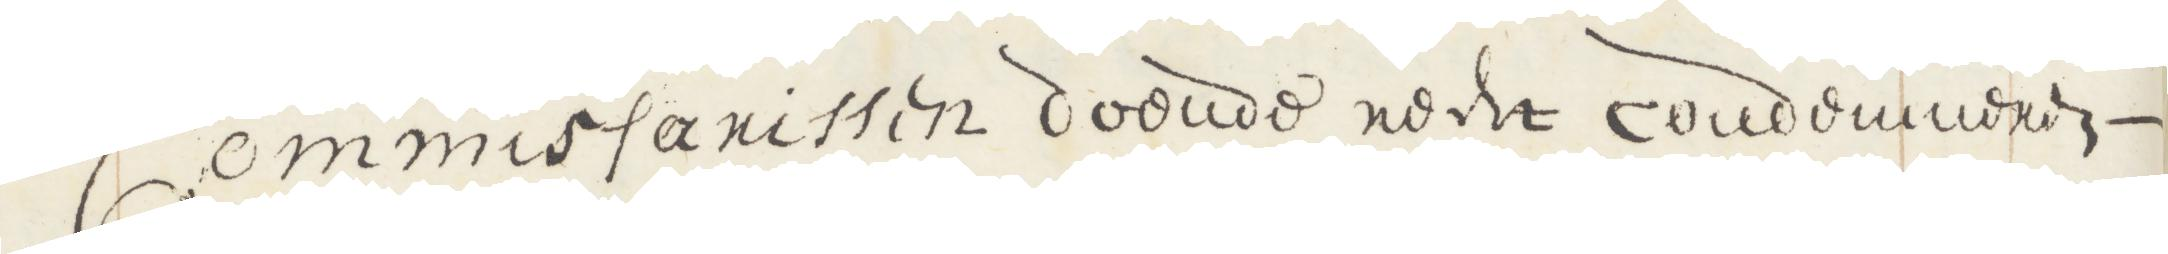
Commissarissen doende recht condemneren —
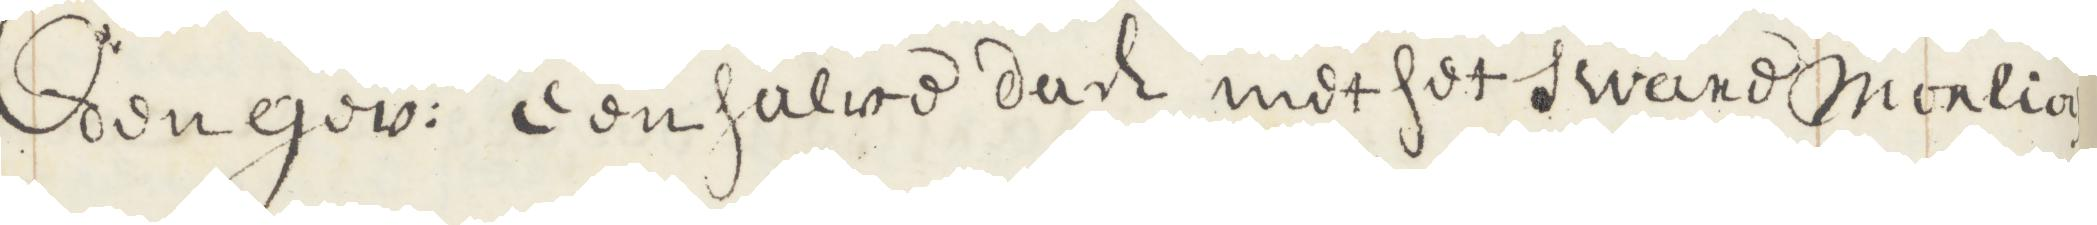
den gev:e een halve dach met het sware Morlioe
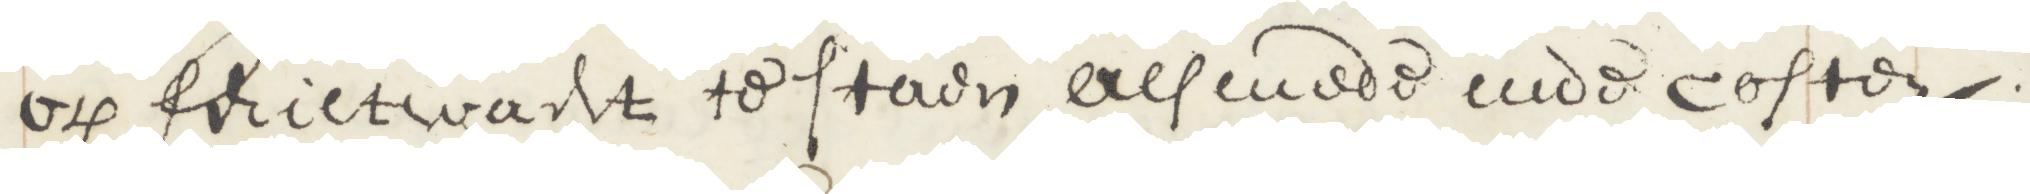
op schiltwacht te staen als mede inde costen /.
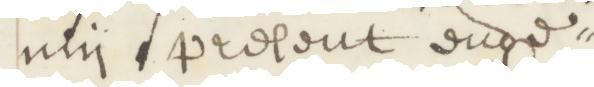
mij present ende„
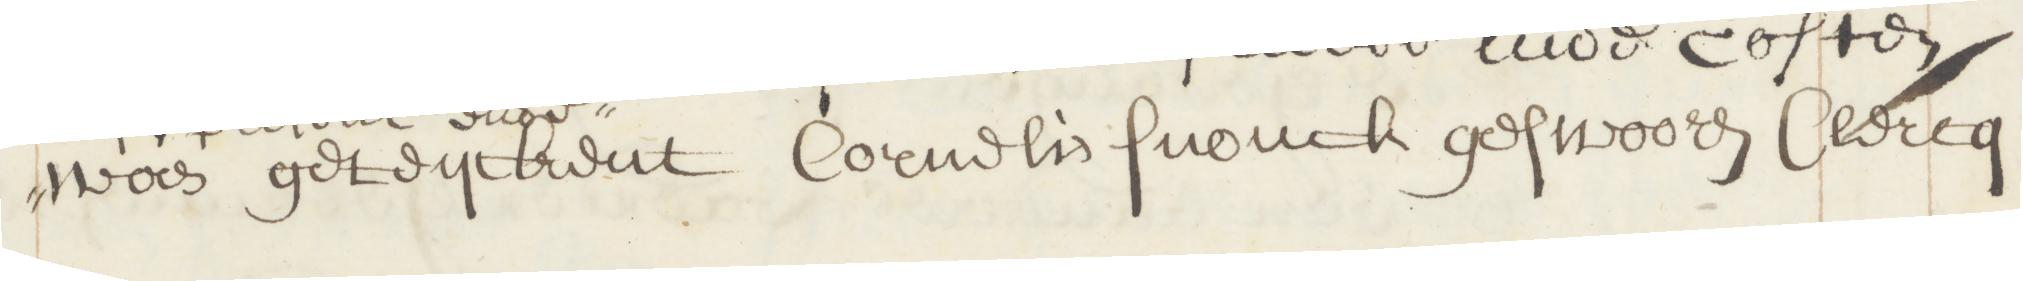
„was geteyckent Cornelis snouck geswooren Clercq
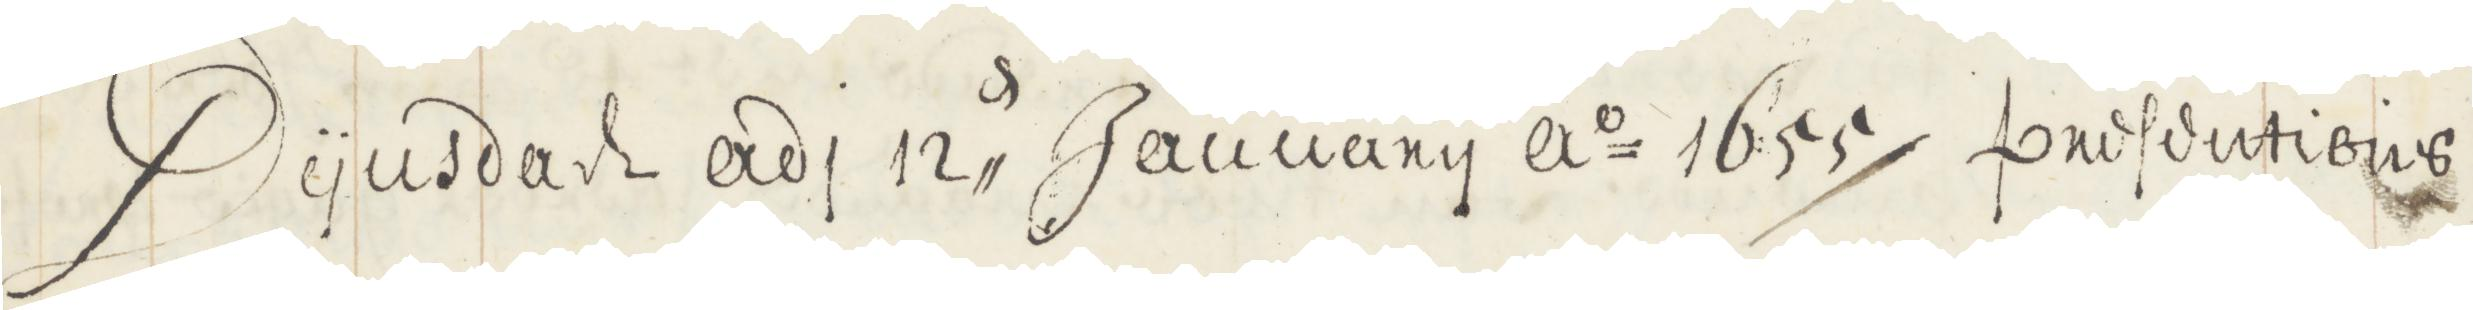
Dijnsdach adj 12„en Januarij a=o 1655, presentibus
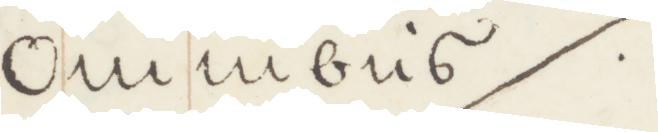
Omnibus/.
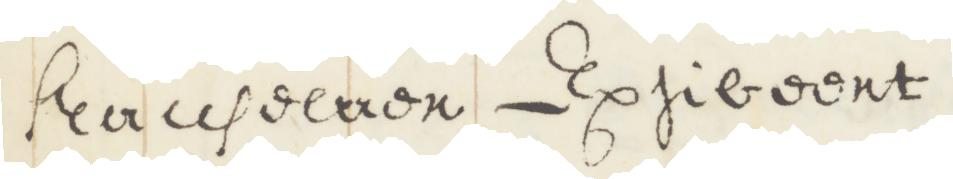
kanselaer Exhibeert
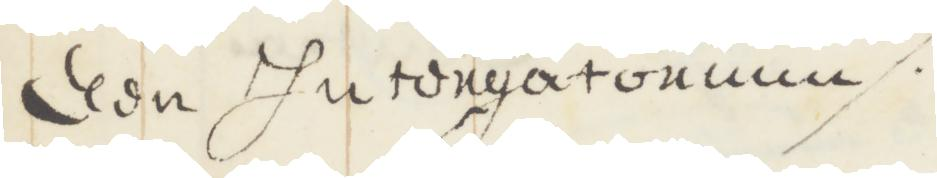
Een Jntergatorium /.
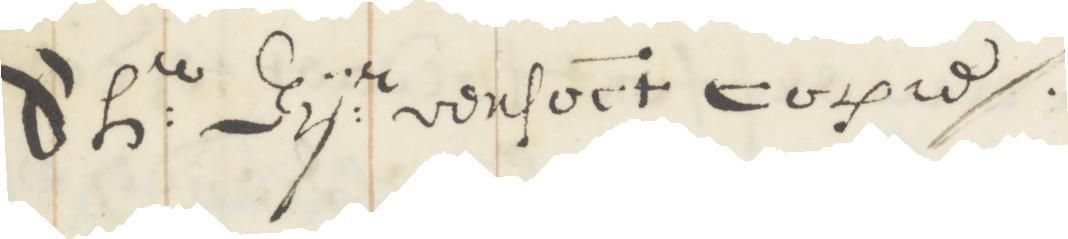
D'h:r Eij:r versoct copie /.
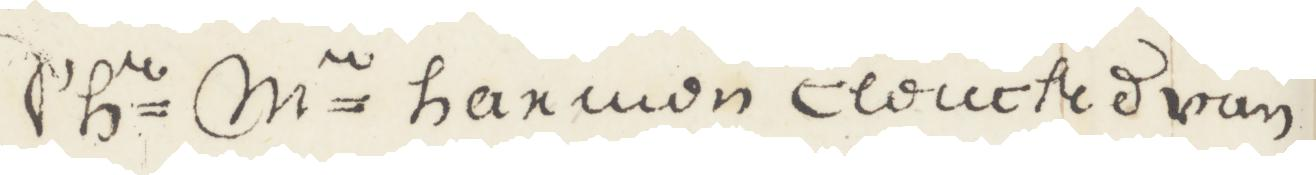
D’ H=r M=r harmen clencke van
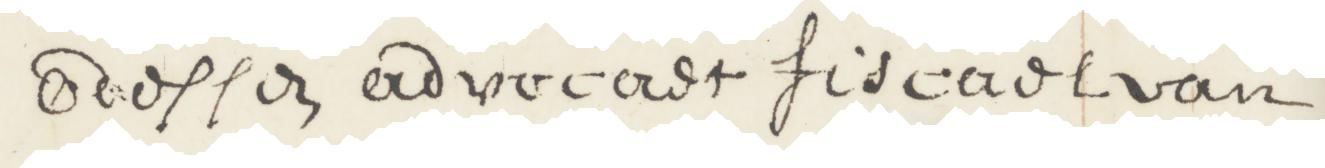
odessen advocaet fiscael van
